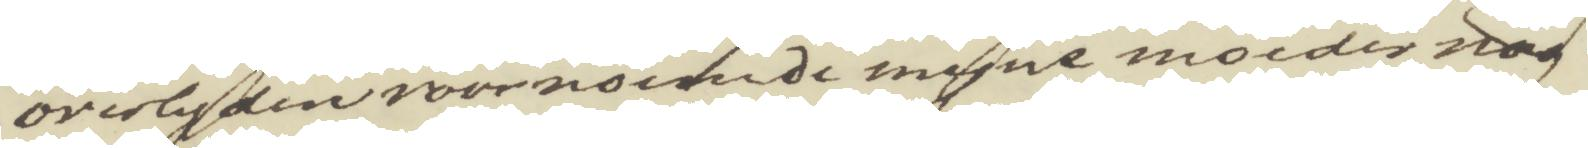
overlyden voornoemde myne moeder nog
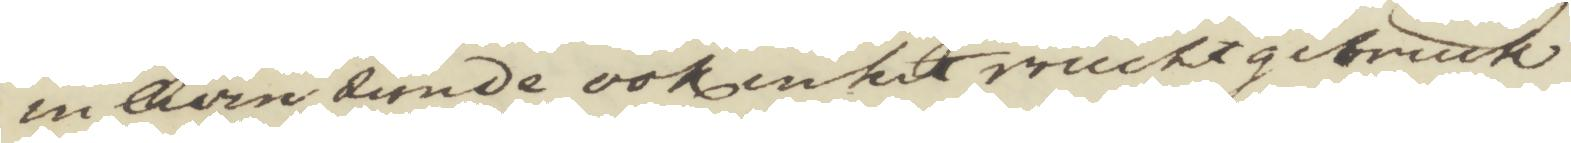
in leven zynde ook in het vruchtgebruik
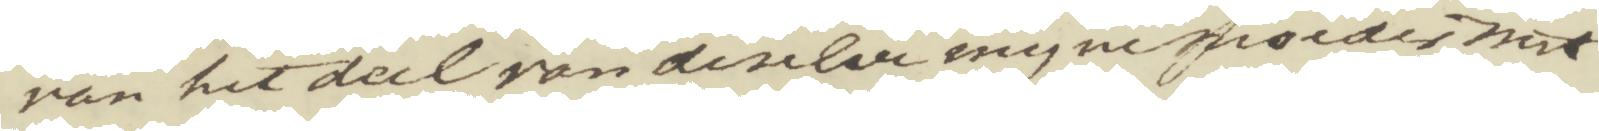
van het deel van dezelve myne moeder met
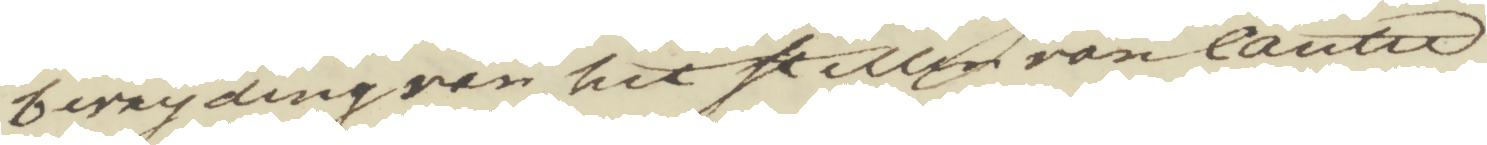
bevryding van het stellen van cautie
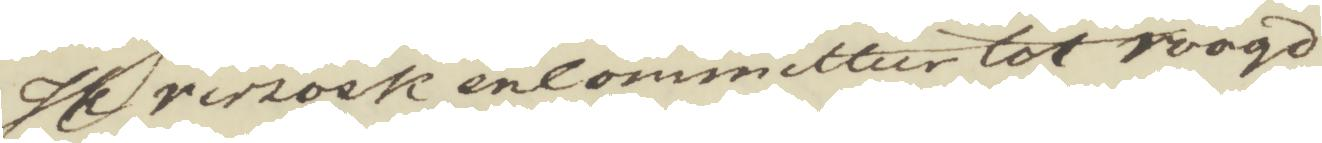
Jk verzoek en committeer tot voogd
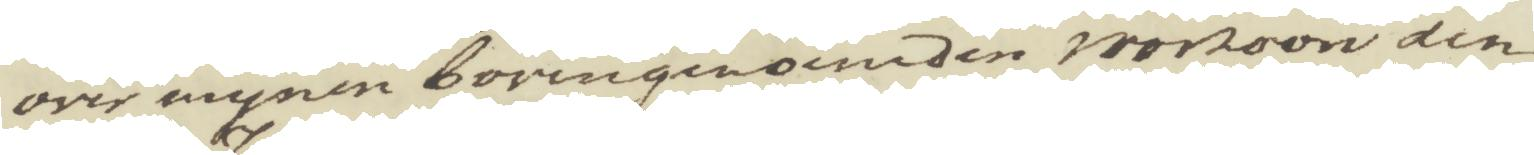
over mynen bovengenoemden voorzoon den
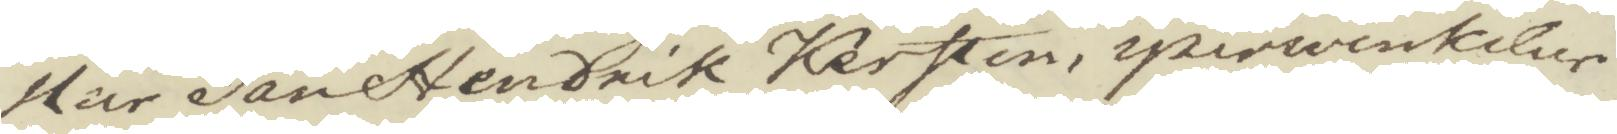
Heer Jan Hendrik Kersten, yzerwinkelier
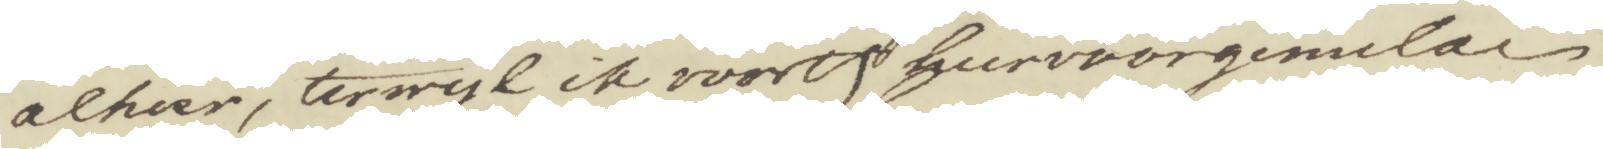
alhier, terwyl ik voorts hiervoorgemelde
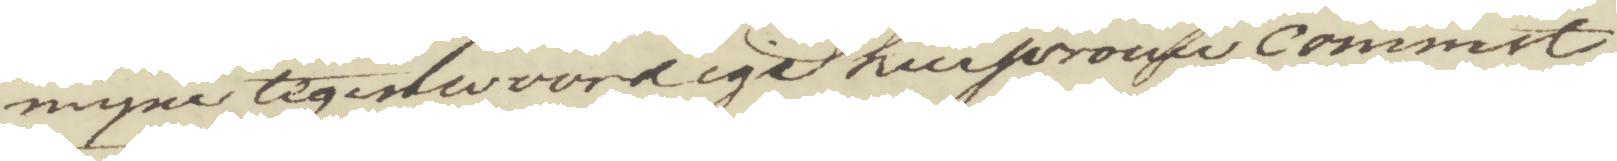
myne tegenwoordige huisvrouw commit,
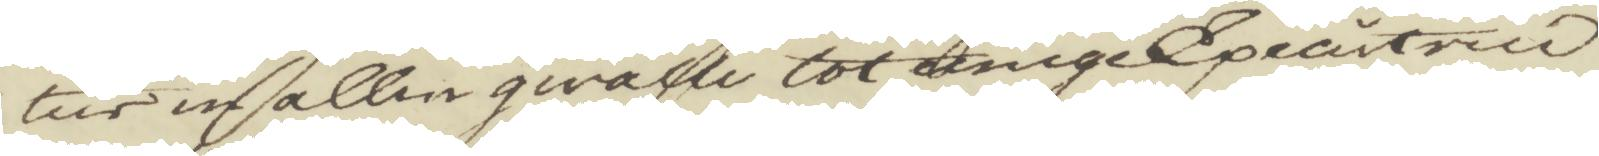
teer in allen gevalle tot eenige Executrice
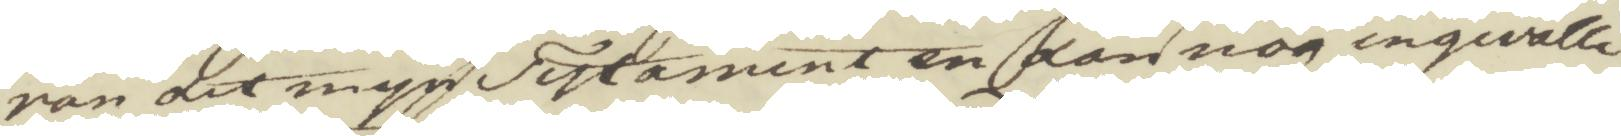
van dit myn Testament en dan nog ingevalle
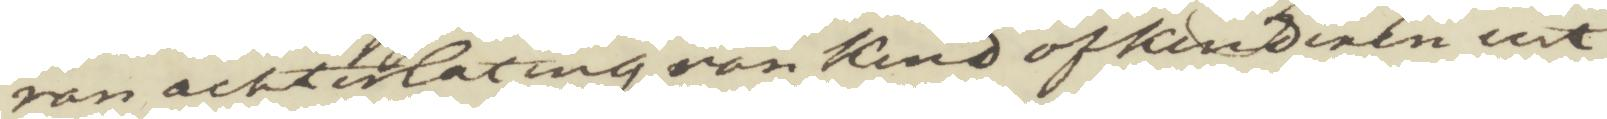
van achterlating van kind of kinderen uit
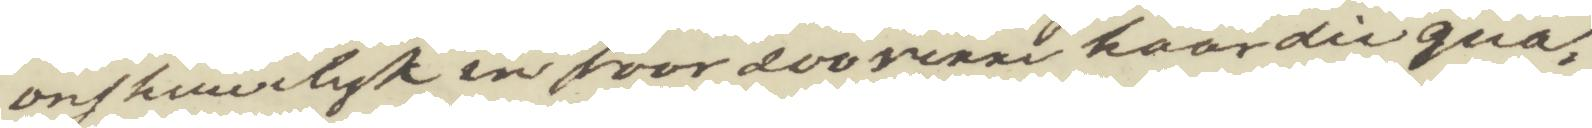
ons huwelyk in voor zooverre haar die qua„
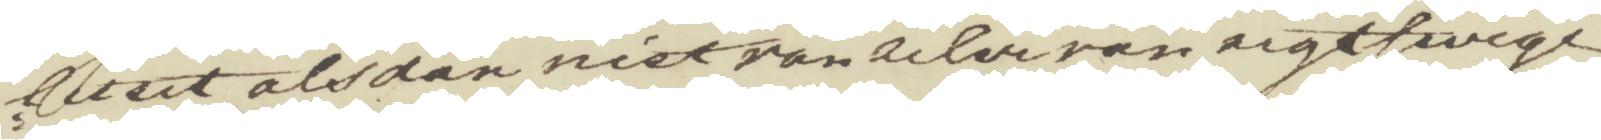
:liteit als dan niet van zelve van regtswege
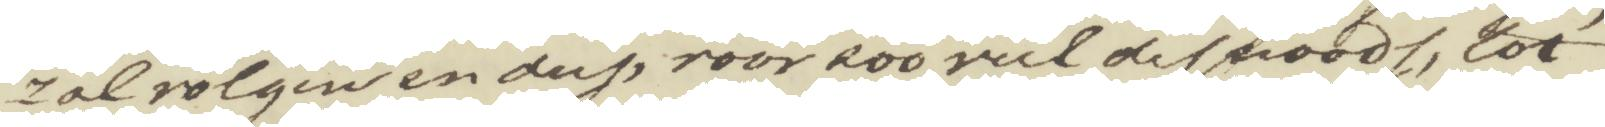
zal volgen en dus, voor zoo veel desnoods, tot
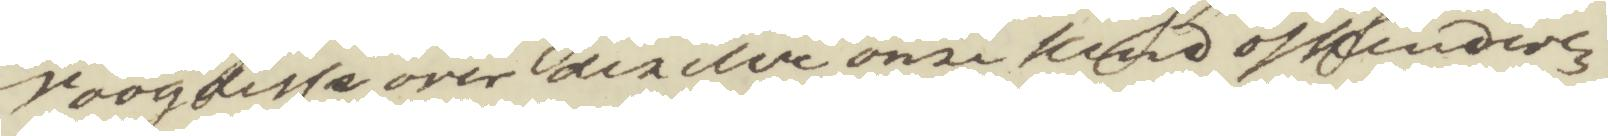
voogdesse over dezelve onze kind of kinderen
